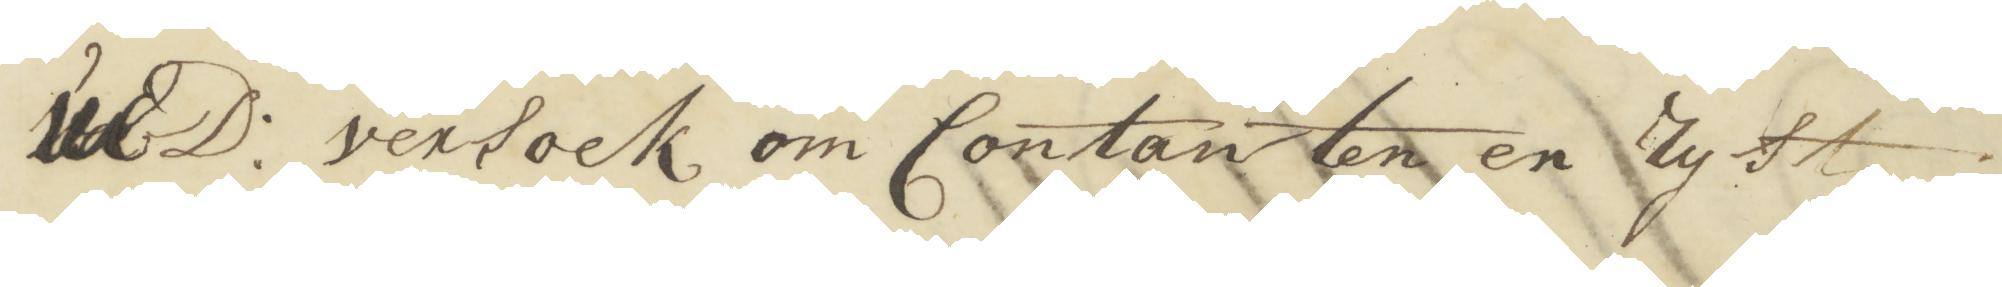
uED: versoek om Contanten en ryst
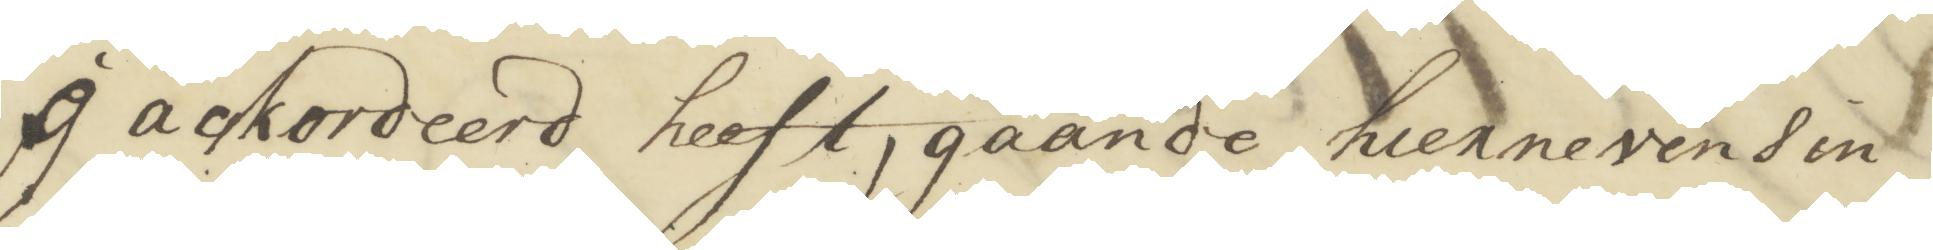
g'ackordeerd heeft, gaande hiernevens in
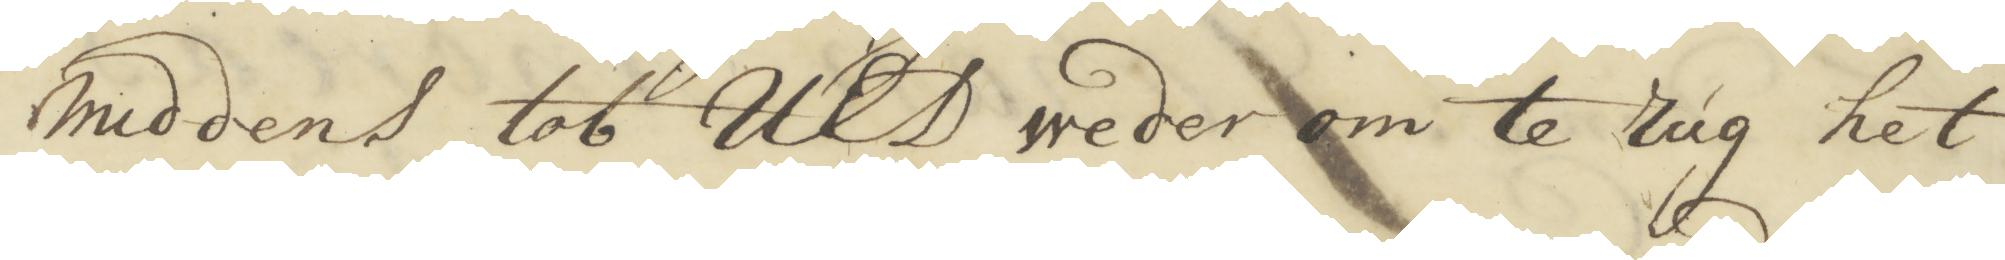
middens tot UED weder om te rug het
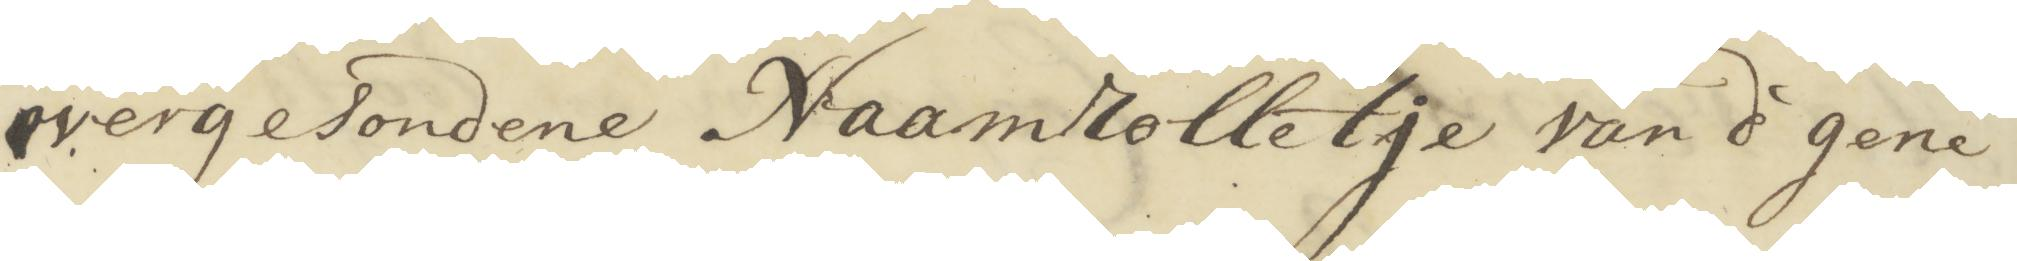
overgesondene Naamrolletje van d'gene
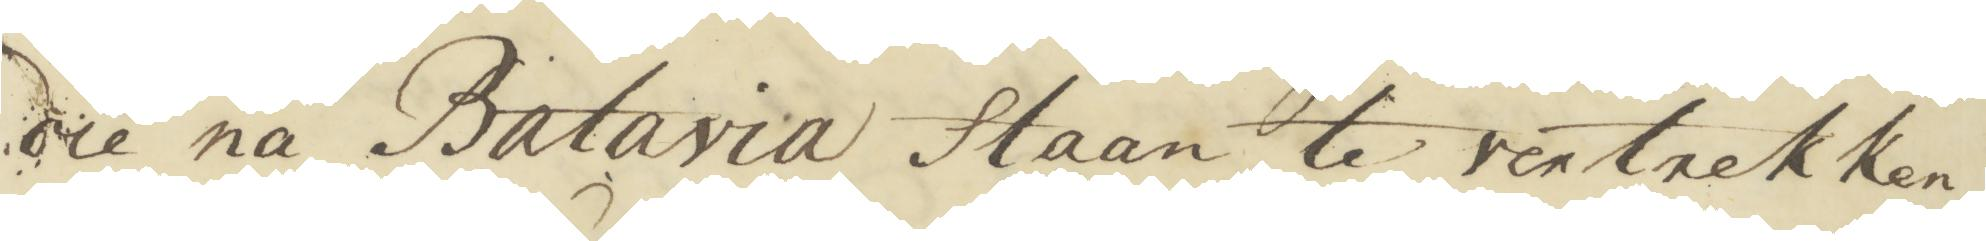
die na Batavia staan te vertrekken
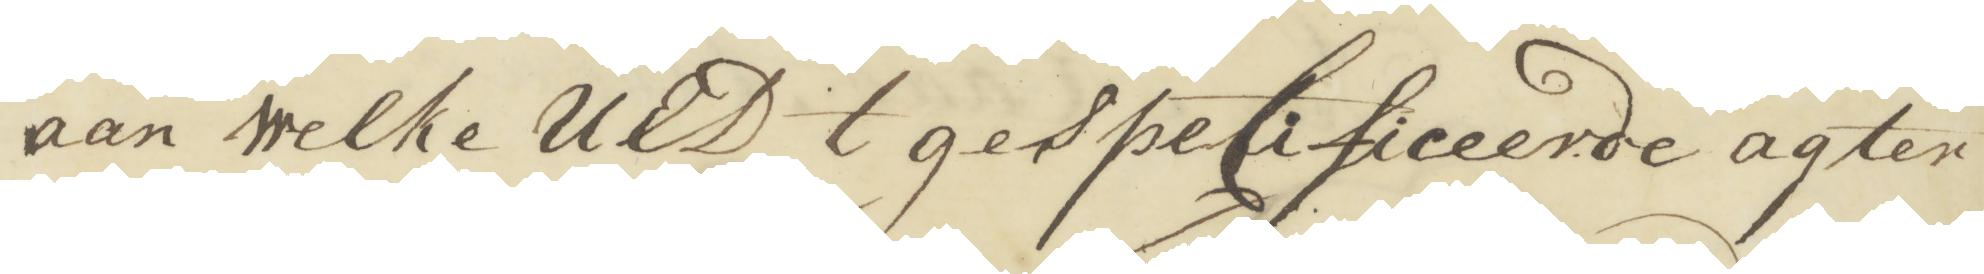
aan welke UED t gespecificeerde agter
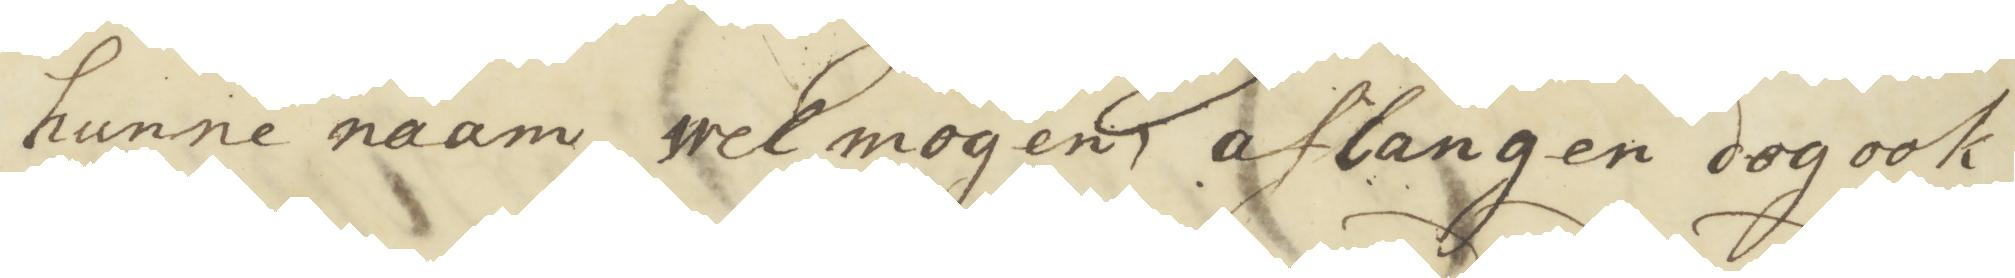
hunne naam wel mogen aflangen dog ook
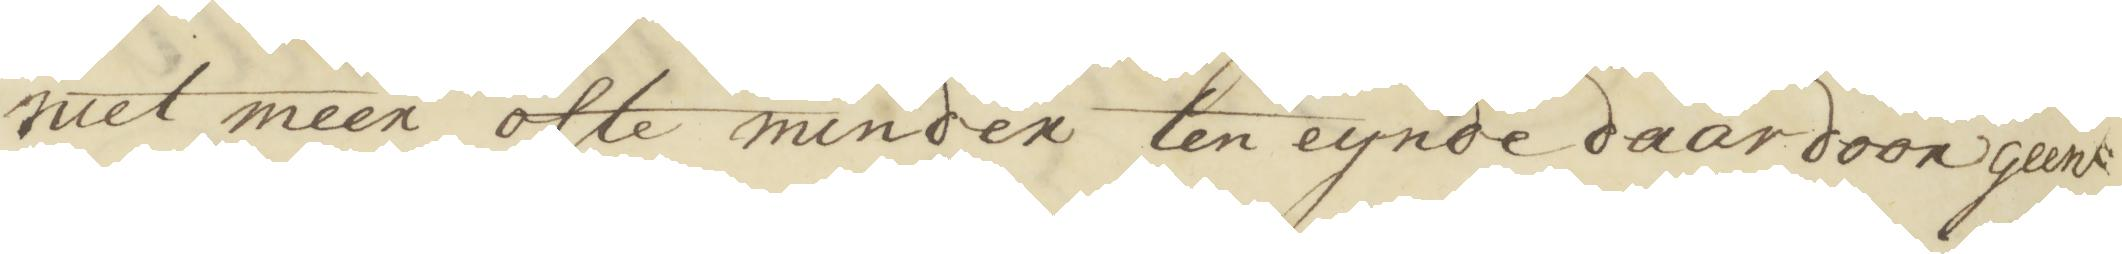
niet meer ofte minder ten eynde daar door geen
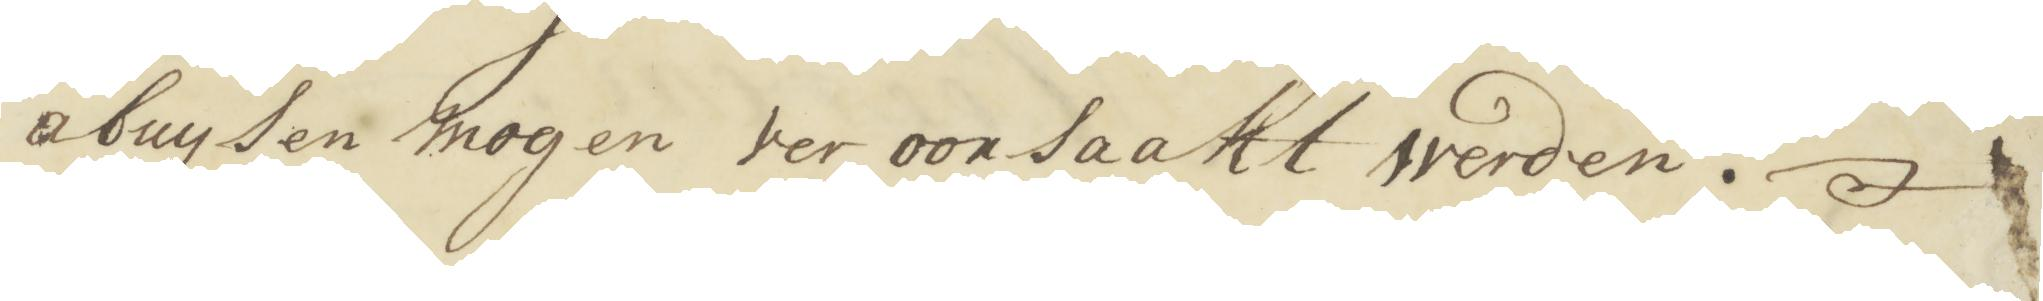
abuysen mogen veroorsaakt werden.
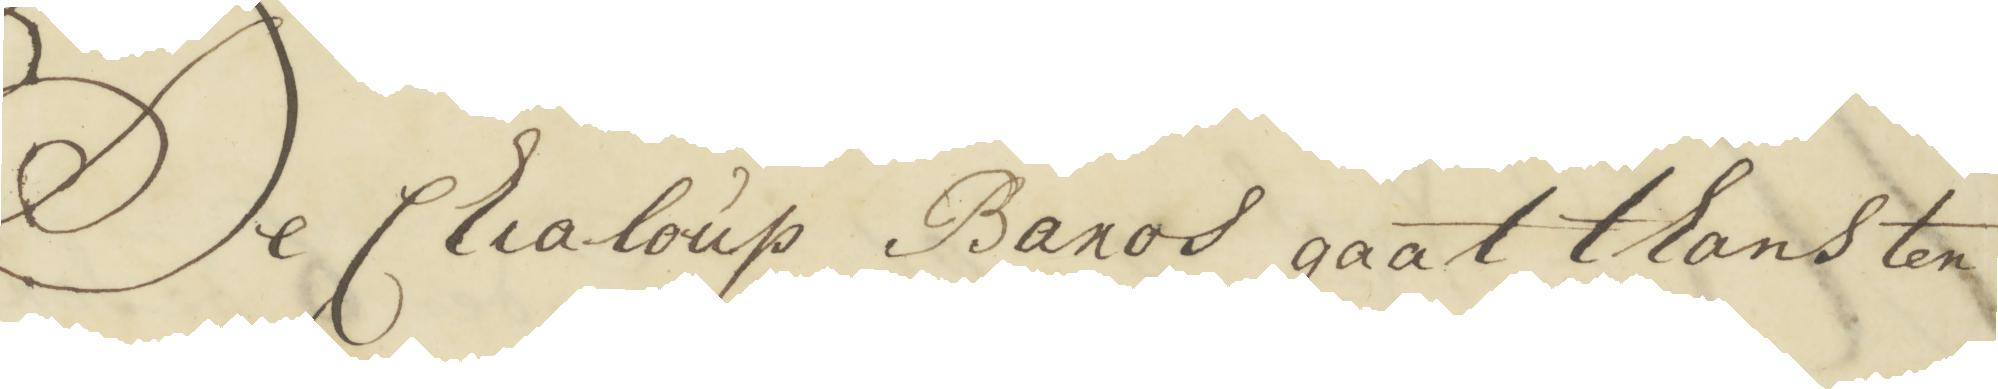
De Chialoup Baros gaat thans ten
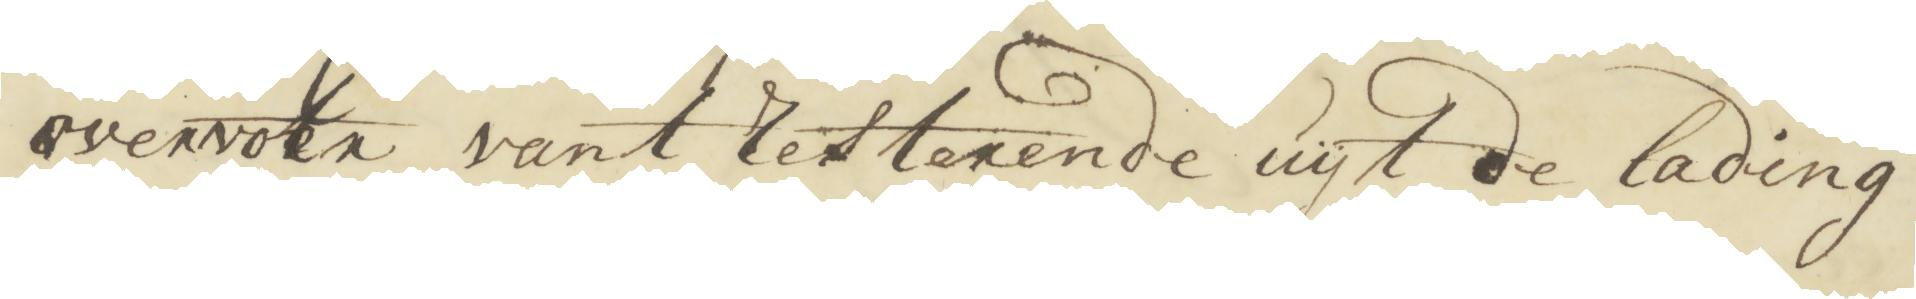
overvoer van t resterende uijt de lading
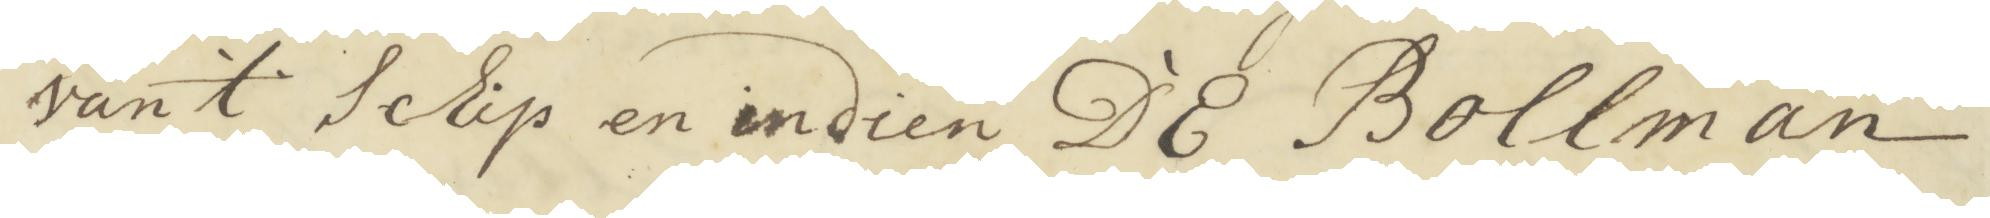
van ’t schip en indien DE Bollman
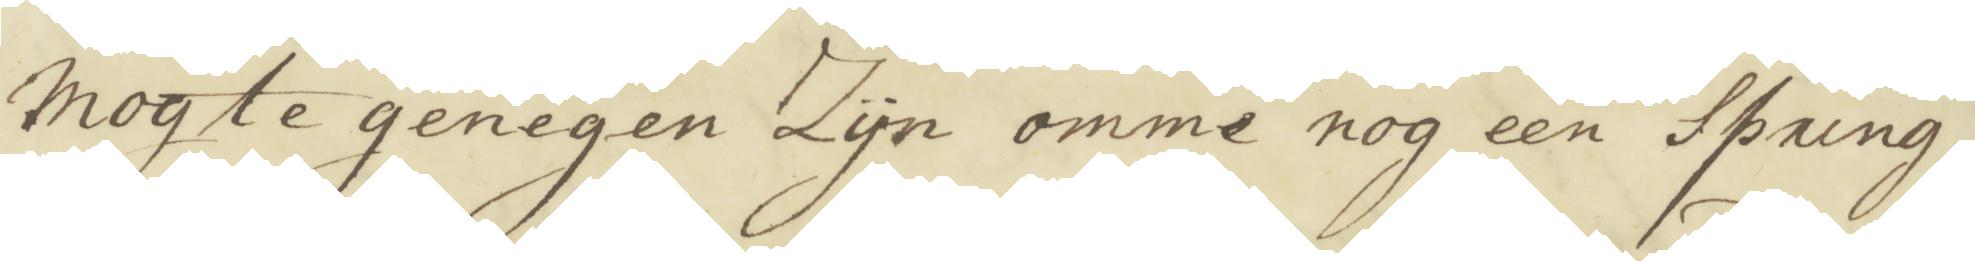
mogte genegen Zijn omme nog een spring
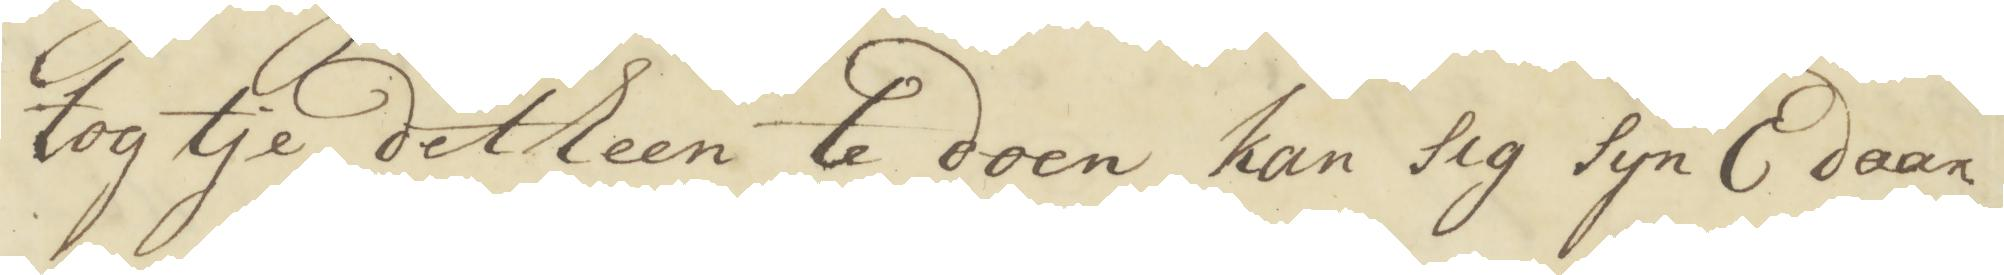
tog tje det heen te doen kan sig syn E daar
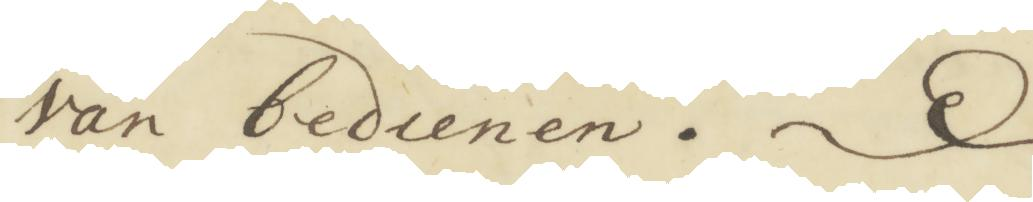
van bedienen.
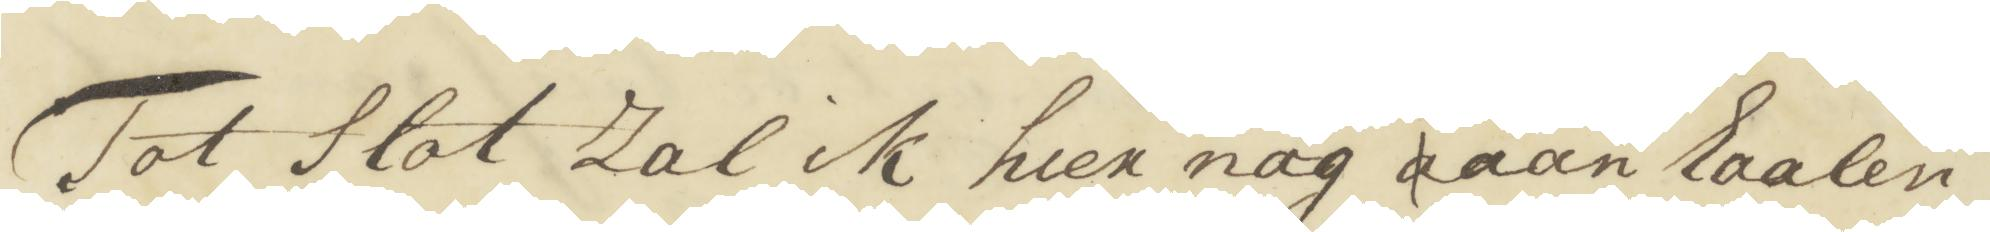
Tot slot zal ik hier nog aaan haalen
